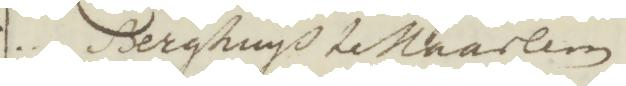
. . . Berghuys te Haarlem
